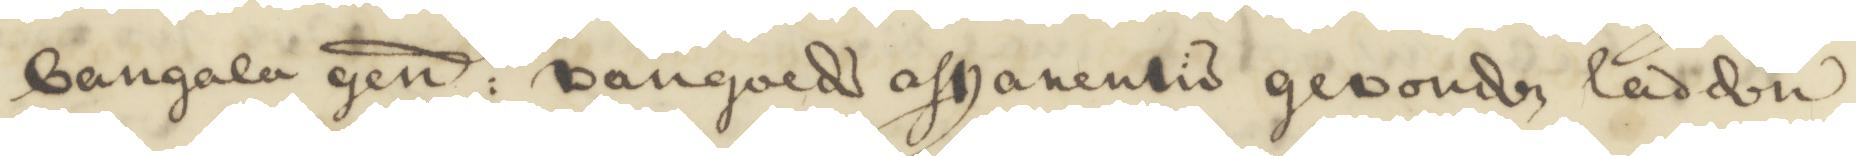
bangala gen:t vangoede apparentie gevonden hadden
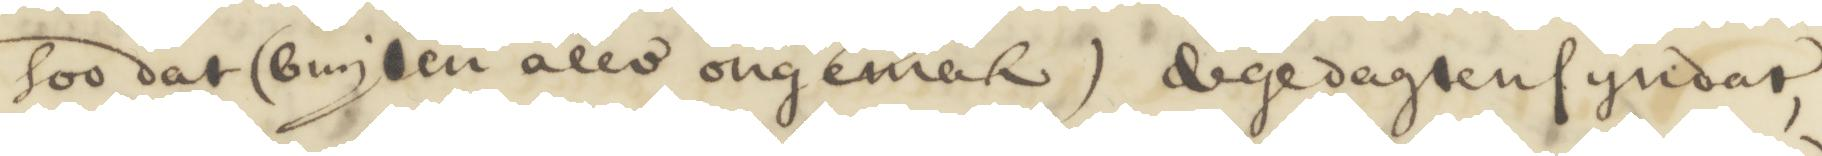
soo dat (buijten alle ongemak) degedagten syndat,
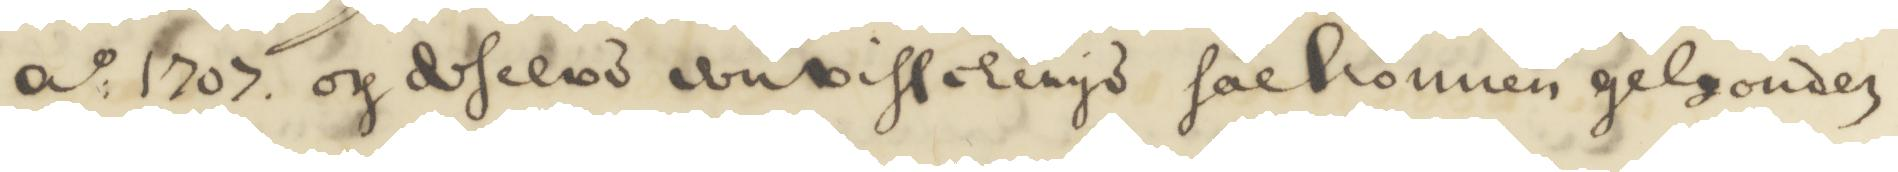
a:o 1707. op deselve eenvisscherije salkonnen gehouden
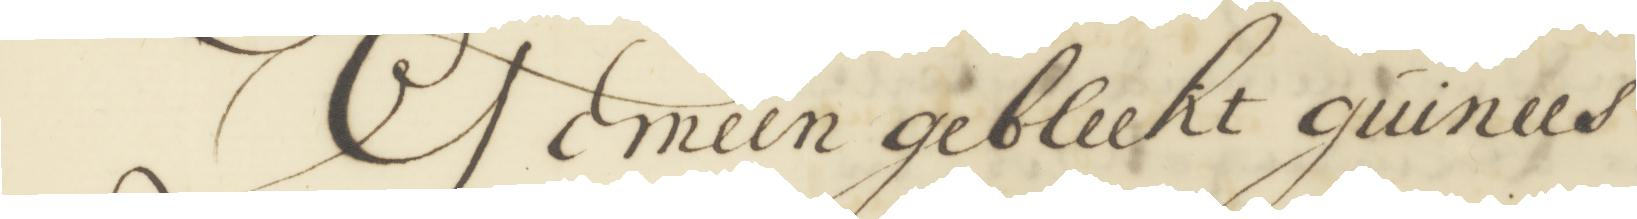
Gemeen gebleekt guinees
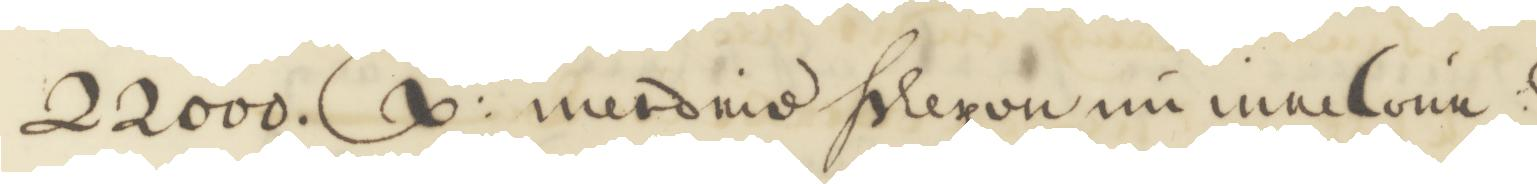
22000. p:s met drie schepen nu inretour:
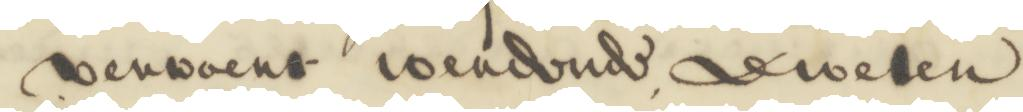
vervoert werdende, teweten
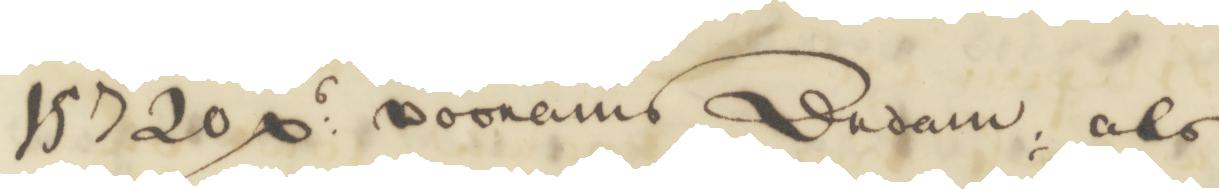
15720 p:s vooramsterdam, als
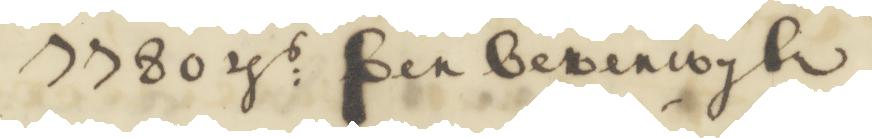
7780 p:s per beverwijk
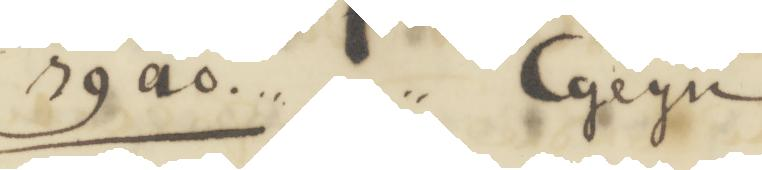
7940„ „ tgeijn
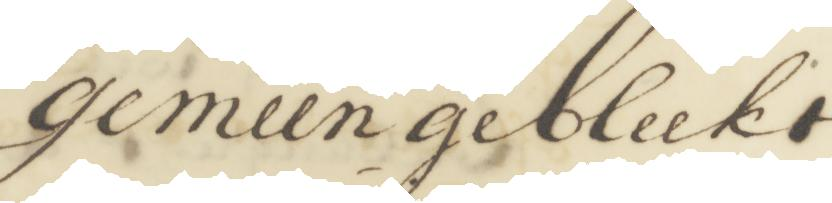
gemeen gebleekt
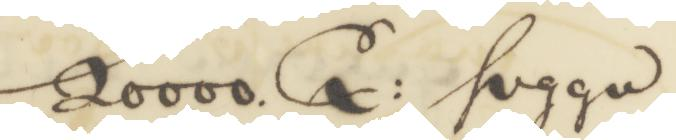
20000. p:s segge
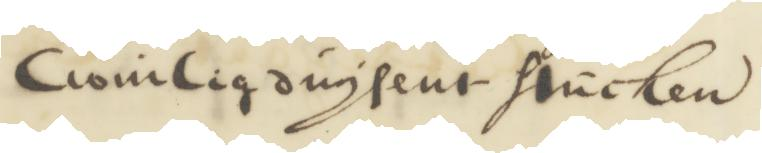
twintig duijsent stucken
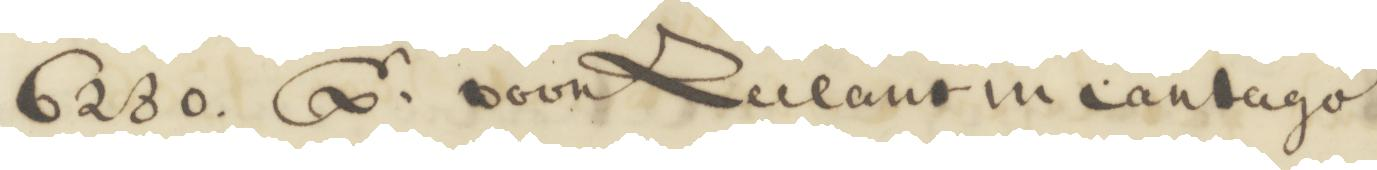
6230. p:s voorZeelant in cartago
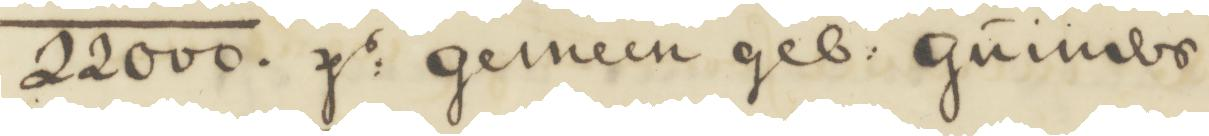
22000. p:s gemeen geb: guinees
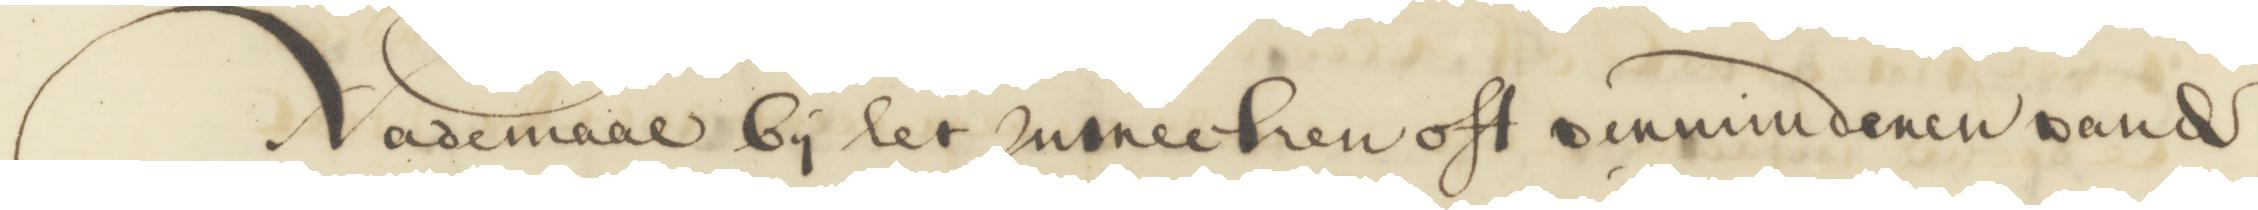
Nademaal bij het jntrecken oft verminderen vande
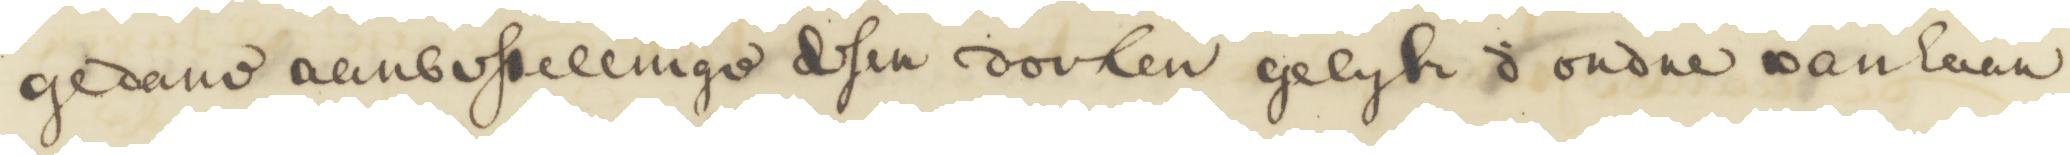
gedane aanbestellinge deser doeken gelijk d' ordre van haar
